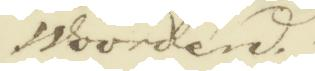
Woorden.
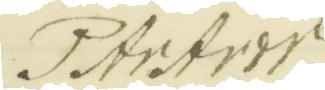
P A v Aror.
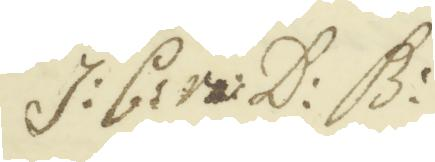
J: C: va: D: B:
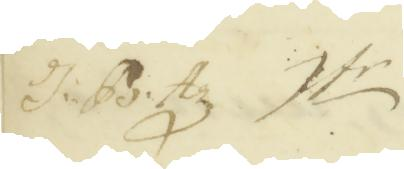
I: B: Az Hr
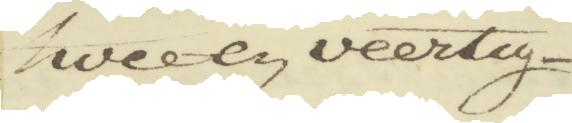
twee en veertig —
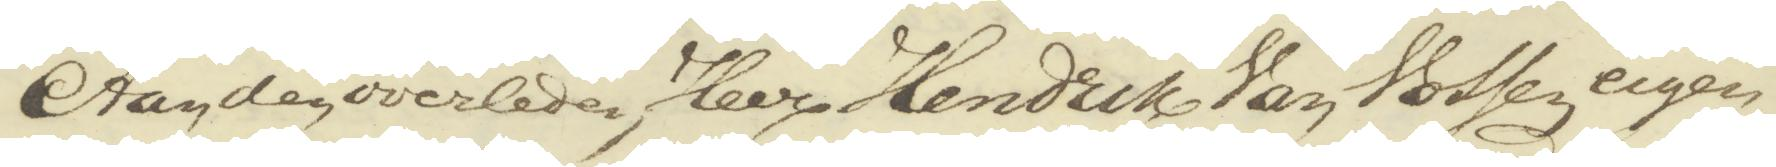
Aan den overleden, Heer Hendrik Van Vossen eigen
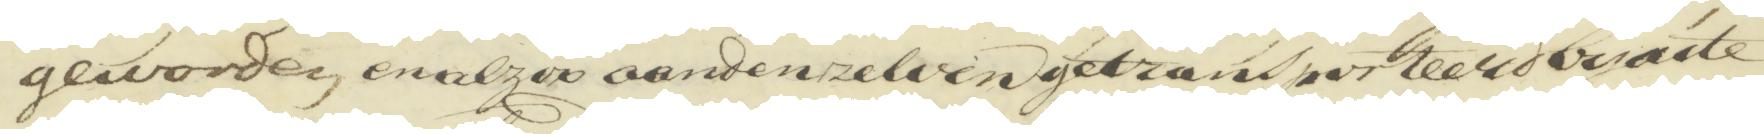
geworden en alzoo aandenzelven getransporteerd by acte
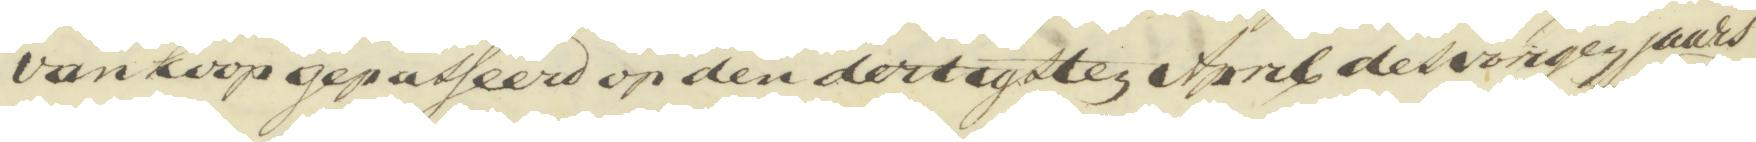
van koop gepasseerd op den dertigsten April des vorigen jaars
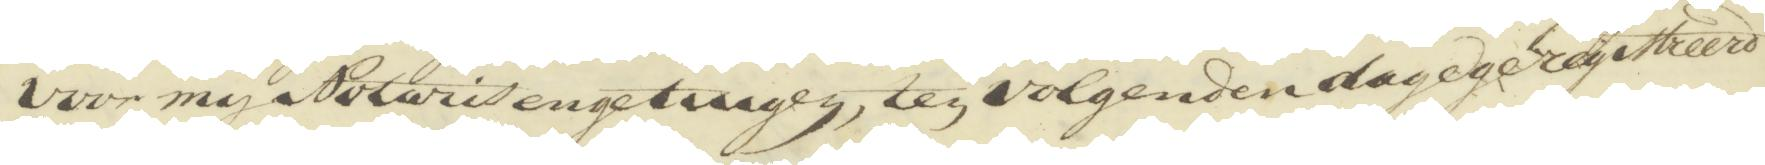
voor my Notaris en getuigen, ten volgenden dage geregistreerd
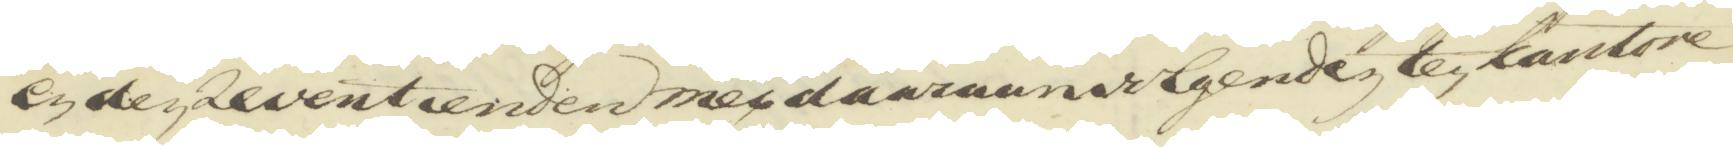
En den Zeventienden met daaraan volgenden ten kantore
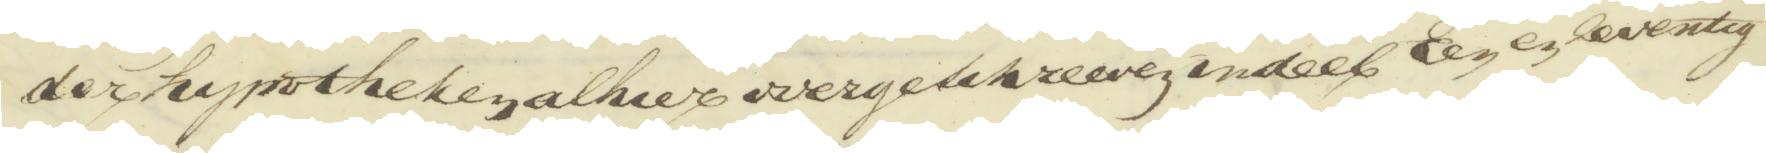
der hypotheken alhier overgeschreeven in deel Een en zeventig
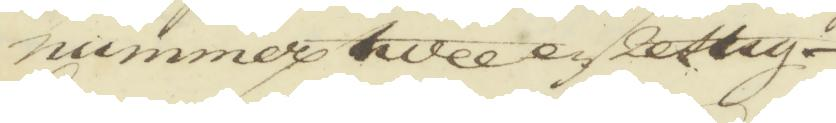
nummer twee en zestig —
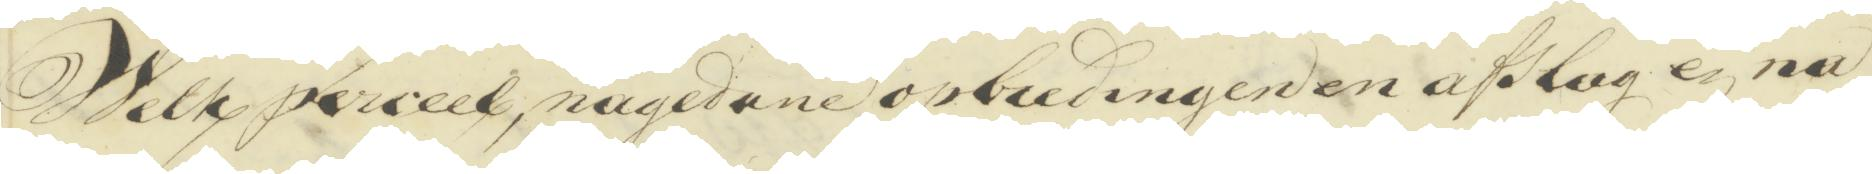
Welk perceel, nagedane opbiedingen en afslag en na
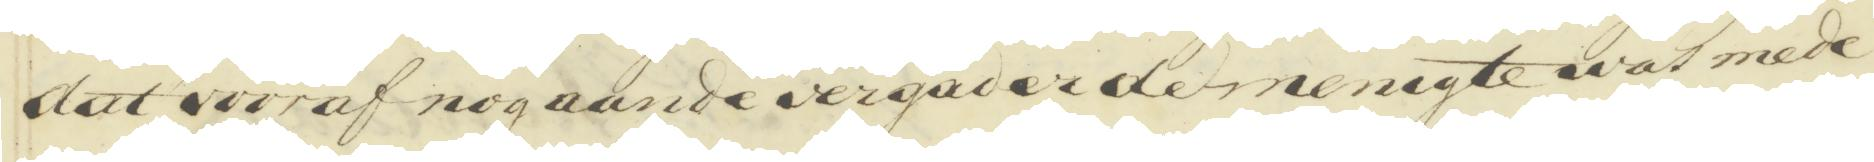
dat vooraf nog aande vergaderde menigte was mede
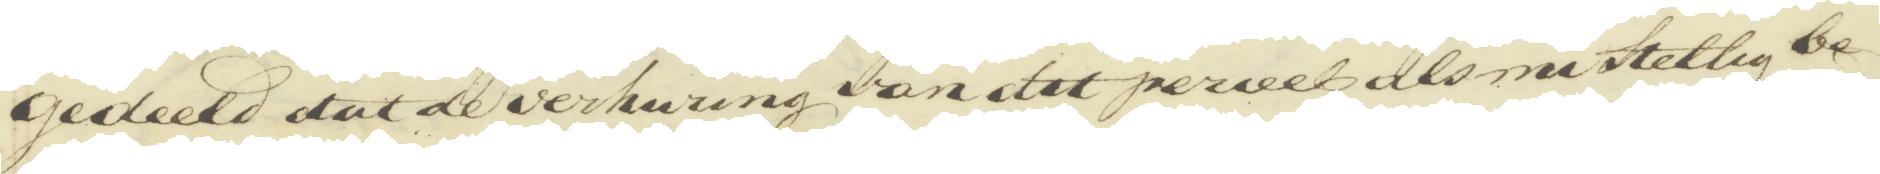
gedeeld dat de verhuring van dit perceel als nu stellig be
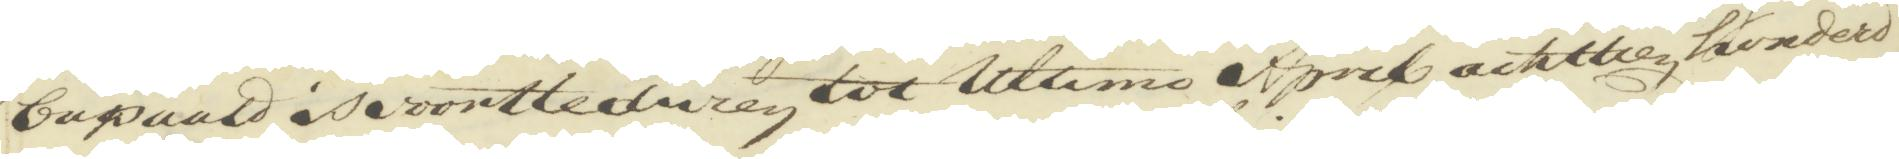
bapaald is voortteduren tot Ultimo April achttien honderd
